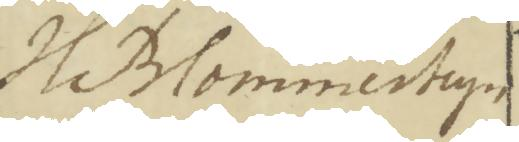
H Blommesteyn
